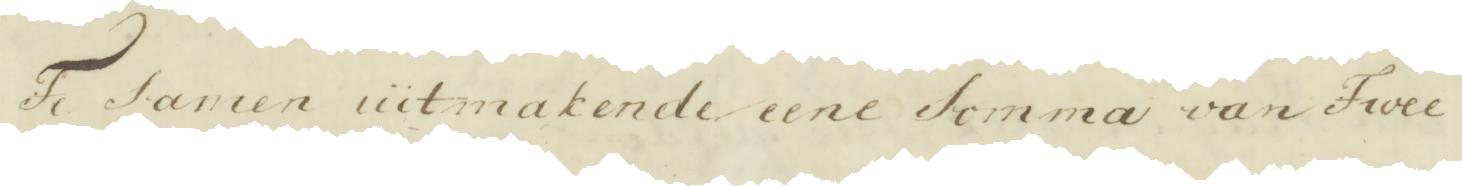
Te samen uitmakende eene somma van Twee
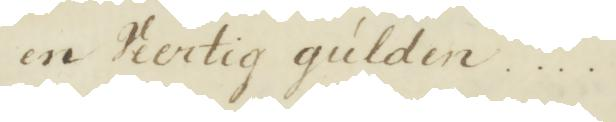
en Veertig gulden . . . .
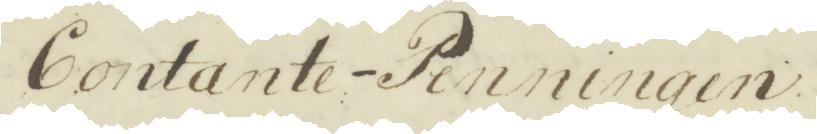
Contante Penningen.
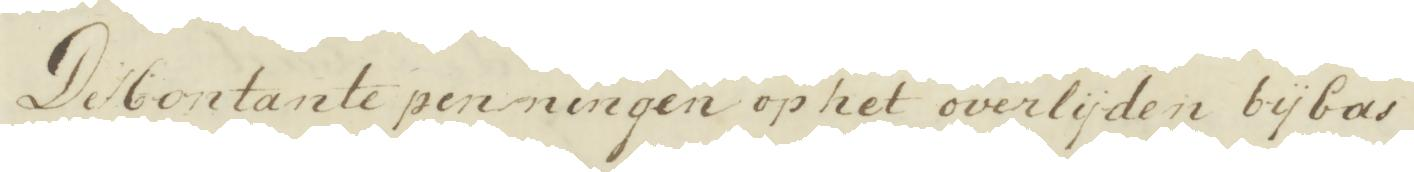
De Contante penningen op het overlijden bij cas
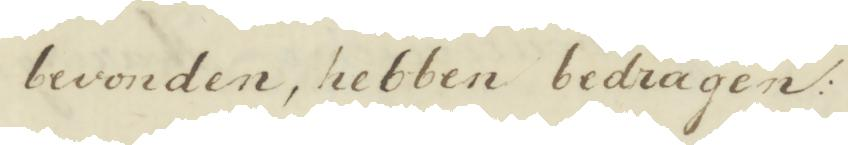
bevonden, hebben bedragen:
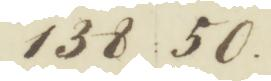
138:50.
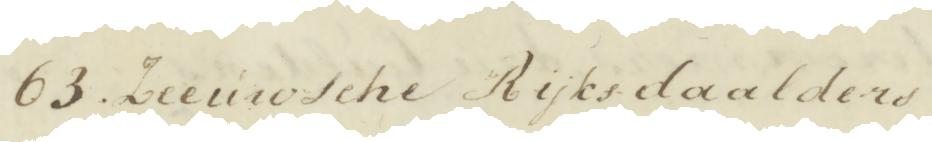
63. Zeeuwsche Rijksdaalders
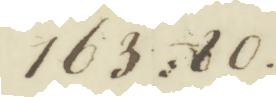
163:80.
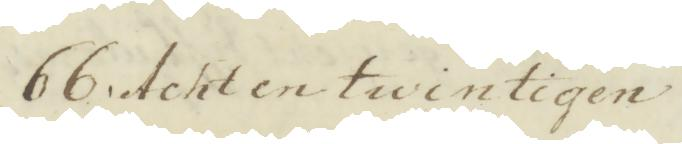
66. Acht en twintigen
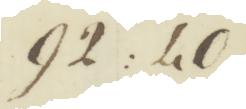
92:40
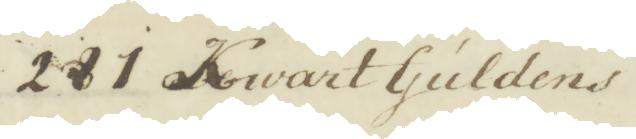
281 Kwart Guldens
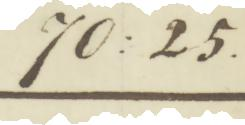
70: 25.
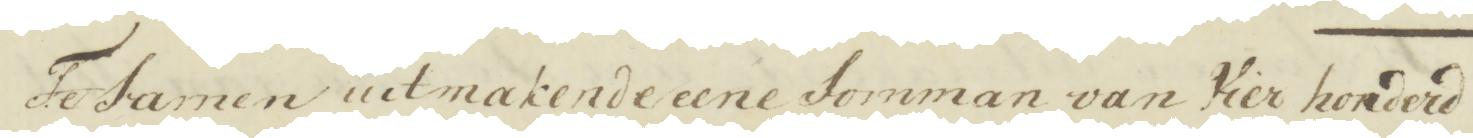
Te samen uitmakende eene somman van Vier honderd
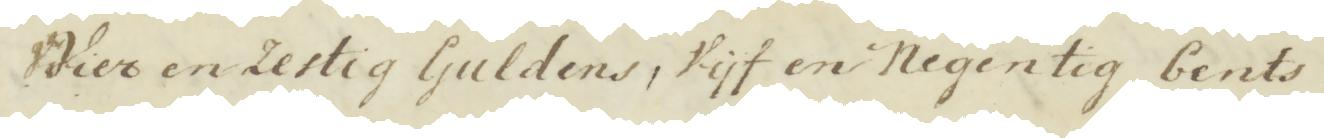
Vier en Zestig Guldens, vijf en negentig Cents
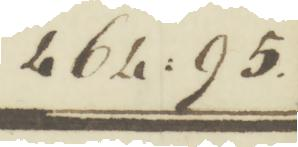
464:93.
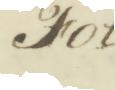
Folio
